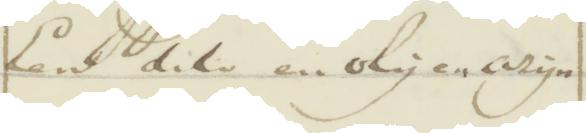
Een dito en olij en azijn
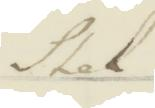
stel
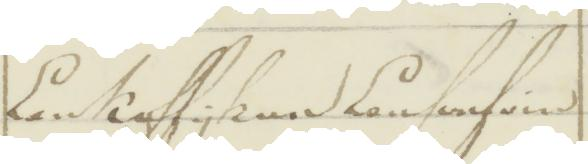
Een koffijkan Een Confoir
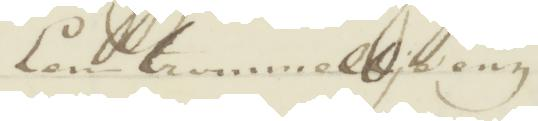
Een trommeltje enz
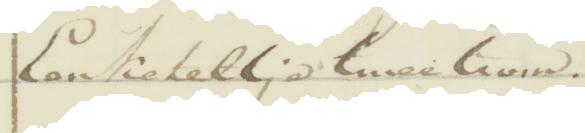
Een keteltje en twee trom.
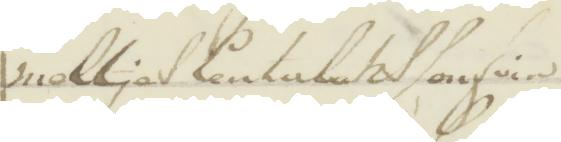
meltjes Eentabaks Confoir
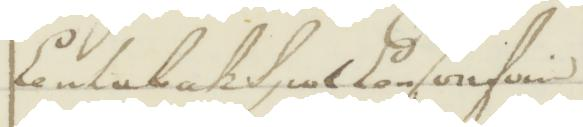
Een tabakspot Een Confoir
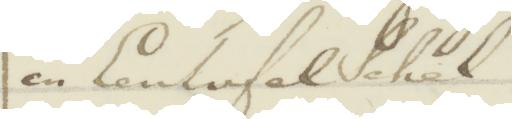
en Eentafel schel
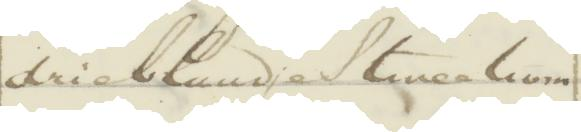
drie blaadjes twee trom
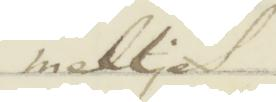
meltjes
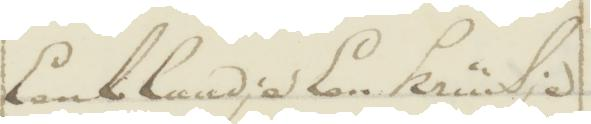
Een blaadje Een kruisje
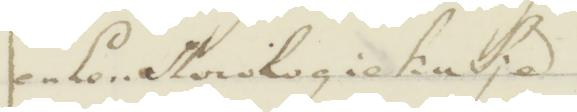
en Een Horologie kasje
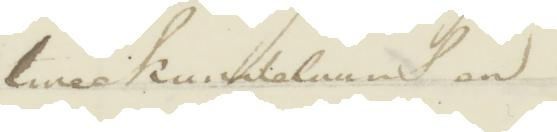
twee kandelaars en
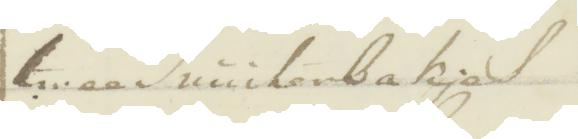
twee suikerbakjes
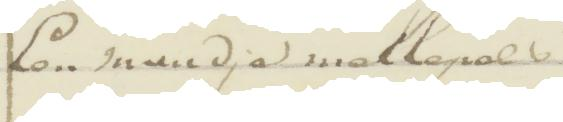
Een mandje met lepels
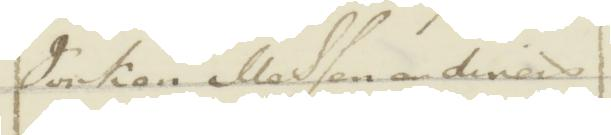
Vorken Messen en divers
